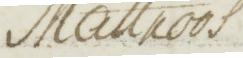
Mattroos
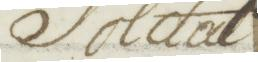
Soldat
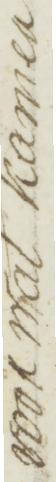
voor wat kamer
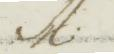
H:
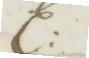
E:
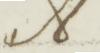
A
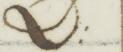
D:
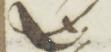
Z;
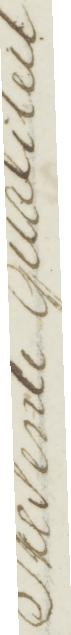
Presente qualiteit
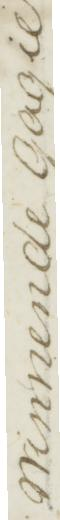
winnende Gagie
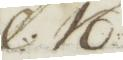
f: 16.
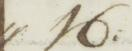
„ 16:
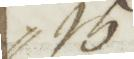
„ 15
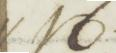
„ 16
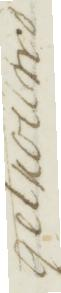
getrouwd
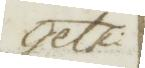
getr:
